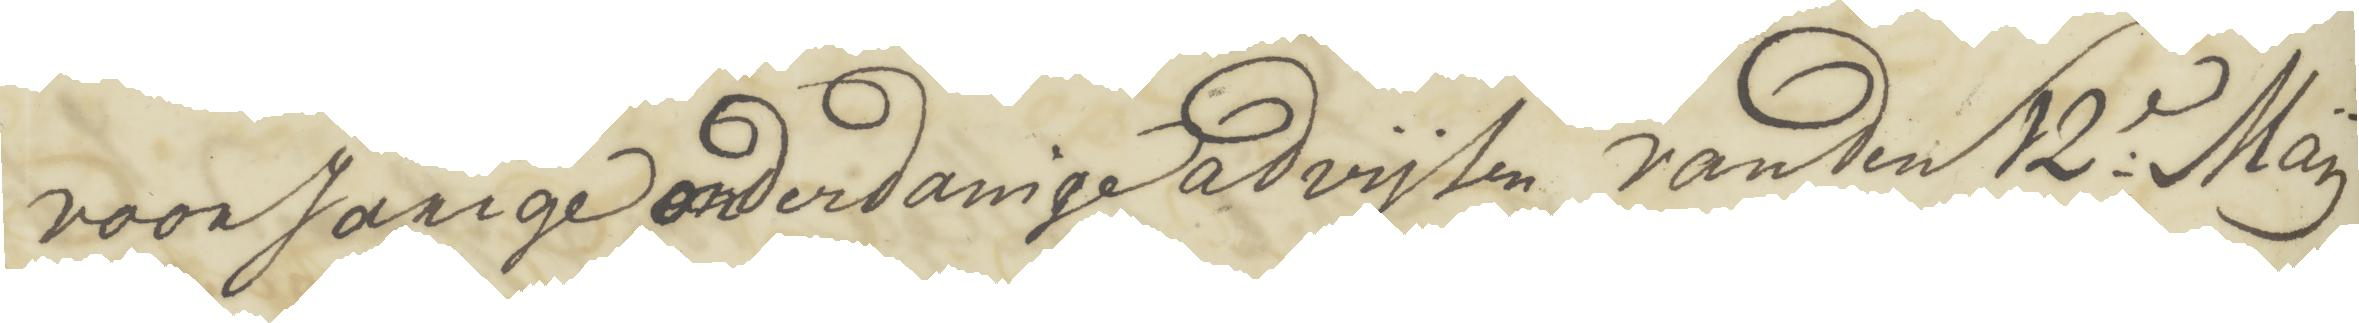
voorjarige onderdanige advijsen van den 12:e Maij
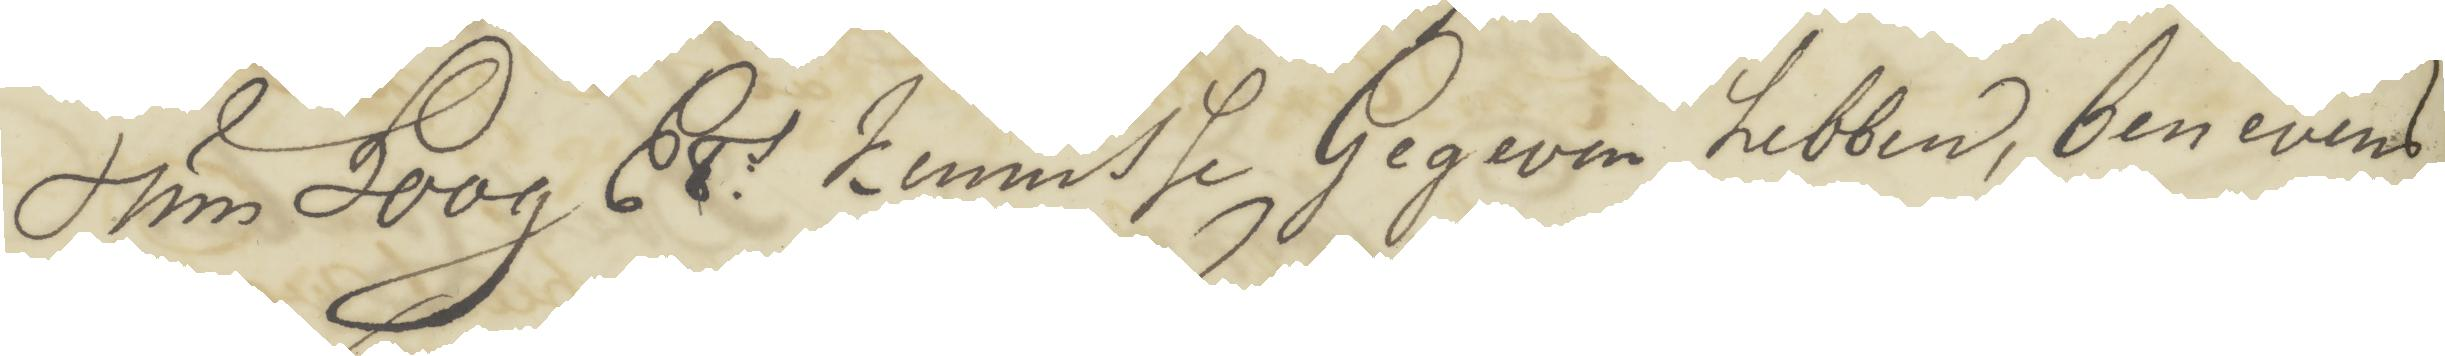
tuw Hoog Ed:s kennisse Gegeven hebben, benevens
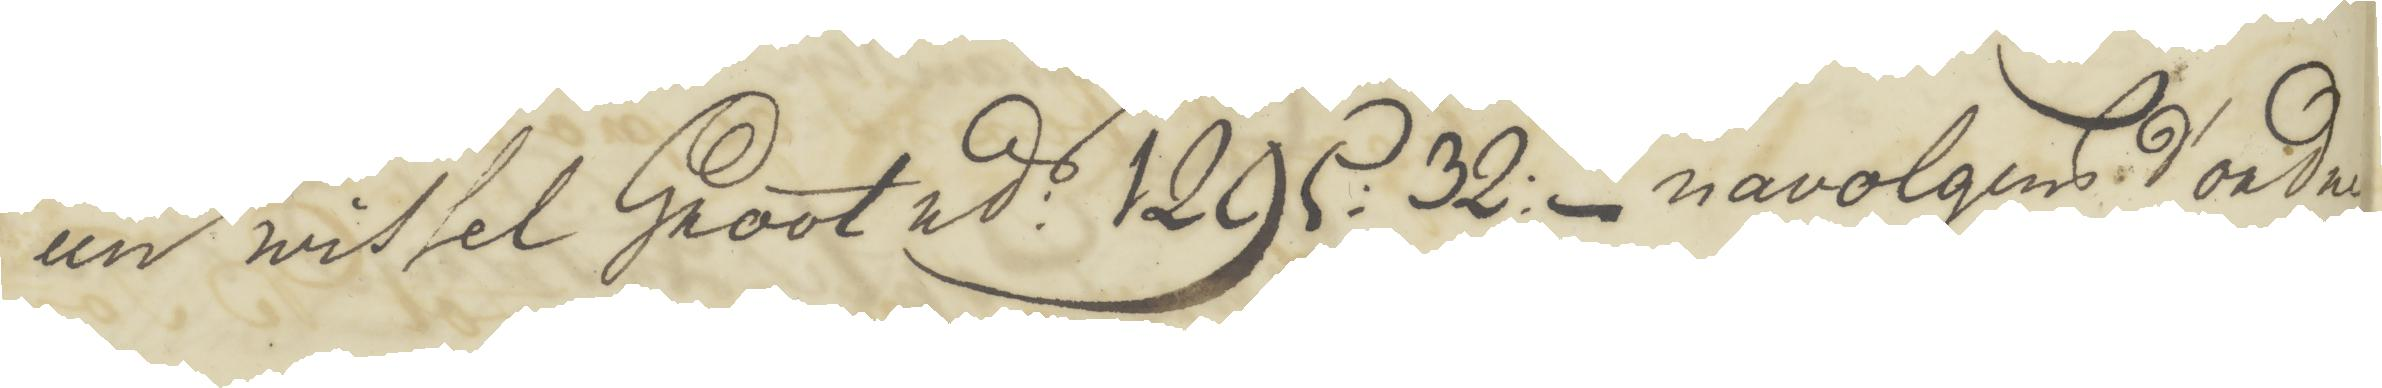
een wissel Groot rd:s 1295:32:— navolgens d'ordre
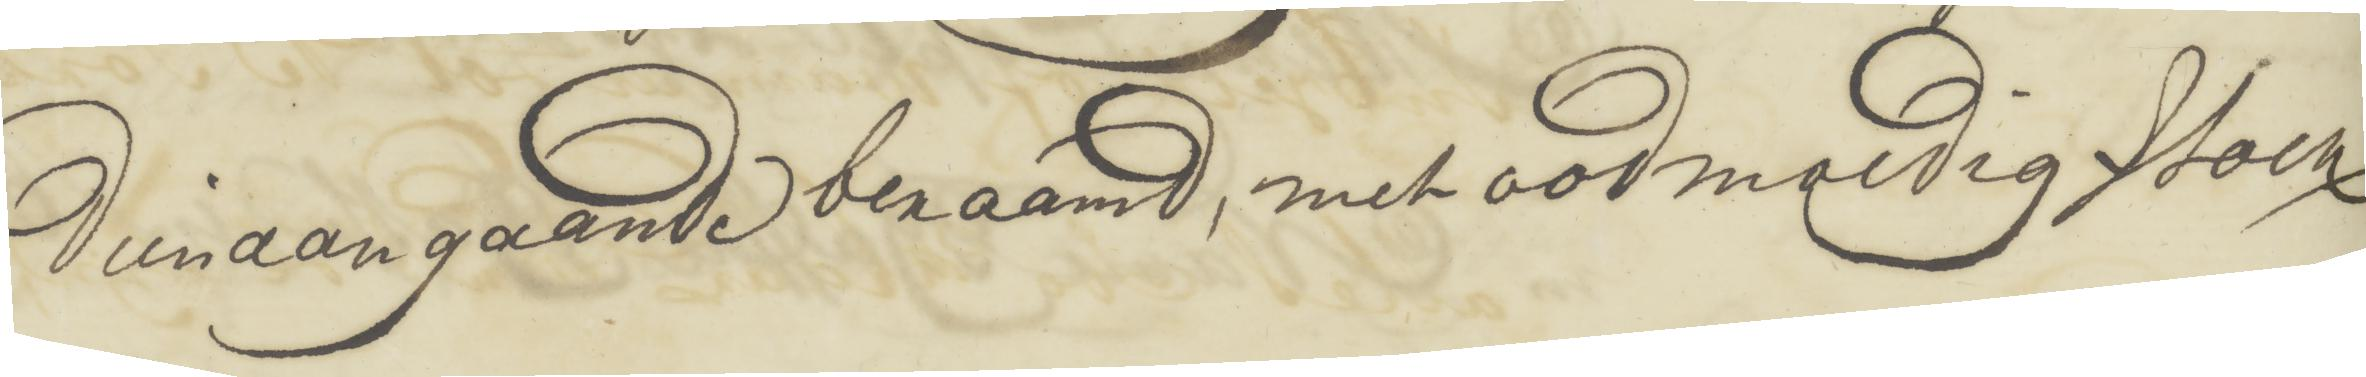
dienaangaande beraamd, met oodmoedig versoek
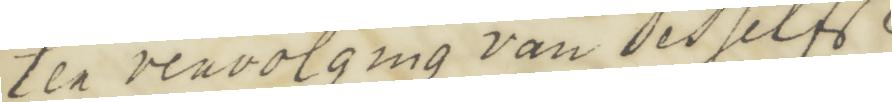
ter vervolging van desselfs
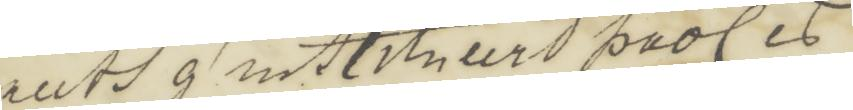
reets g’institueerd proces
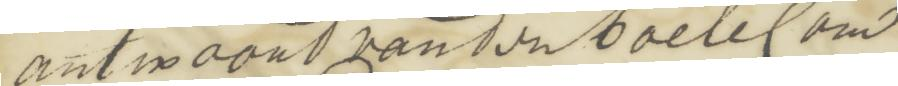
antwoord van den boeleCom
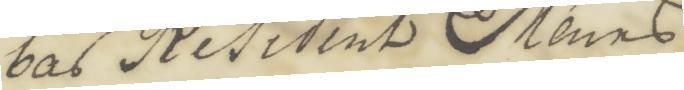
bas Resident Meurs
